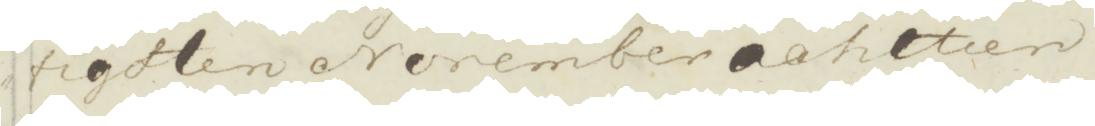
„tigsten November achttien
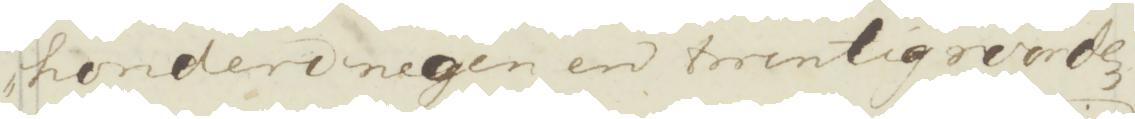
„honderd negen en twintig voor den
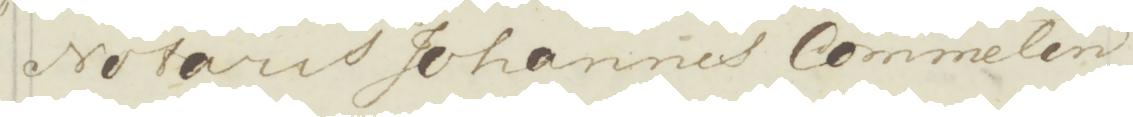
Notaris Johannes Commelin
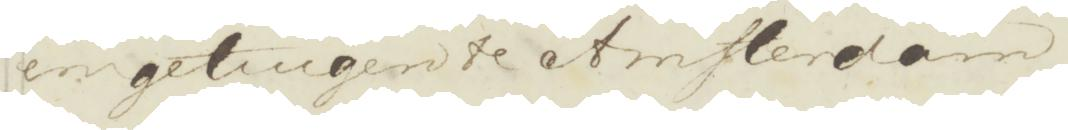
en getuigen te Amsterdam
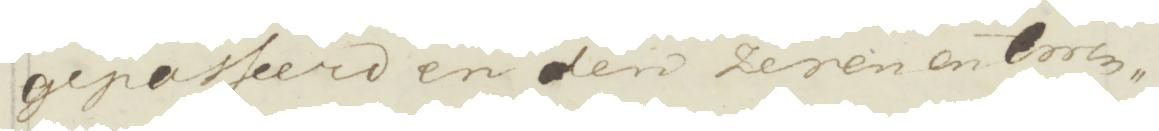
gepasseerd en den zeven en twin„
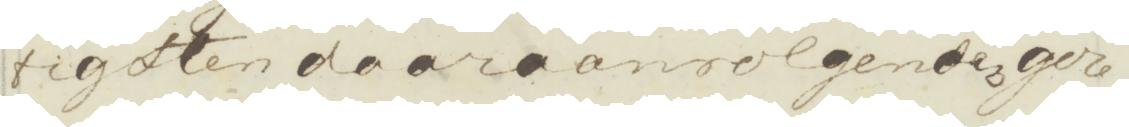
tigsten daaraanvolgende gere
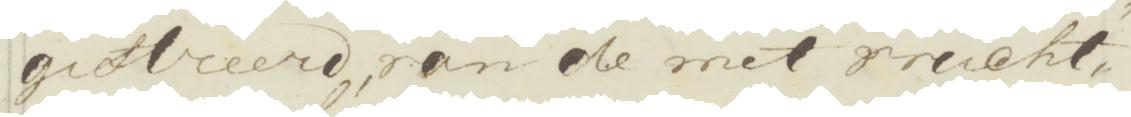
gistreerd, van de wet vrucht„
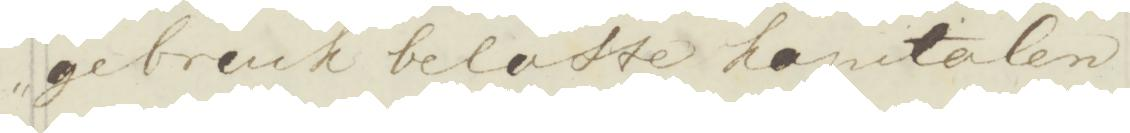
„gebruik belaste kapitalen
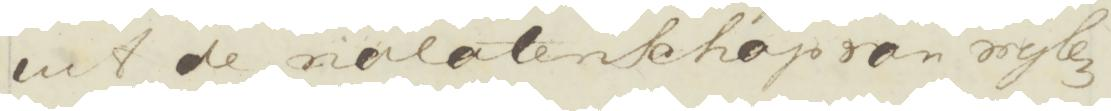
uit de nalatenschap van wylen
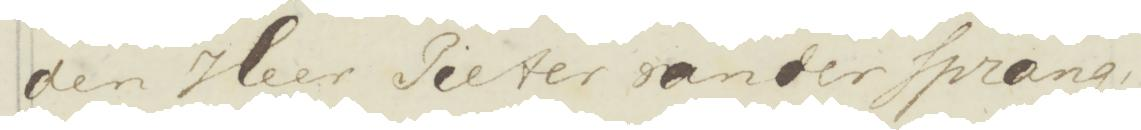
den Heer Pieter van der sprang,
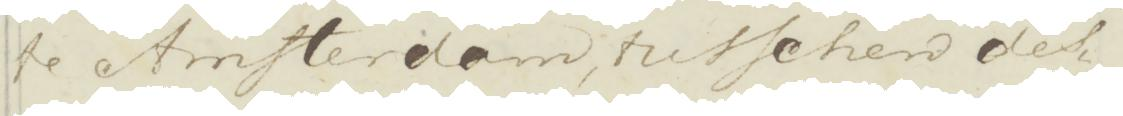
te Amsterdam, tusschen des
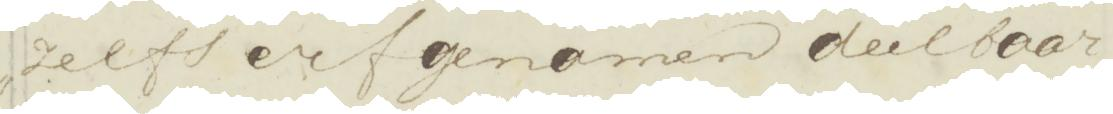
zelfs erfgenamen deelbaar
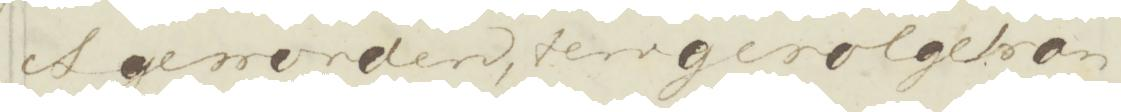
is geworden, ten gevolge van
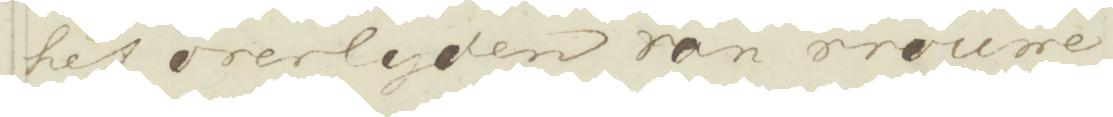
het overlyden van vrouwe
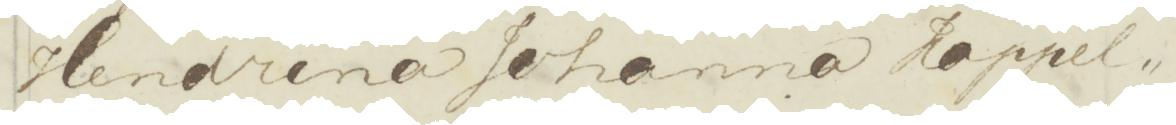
Hendrina Johanna Kappel„
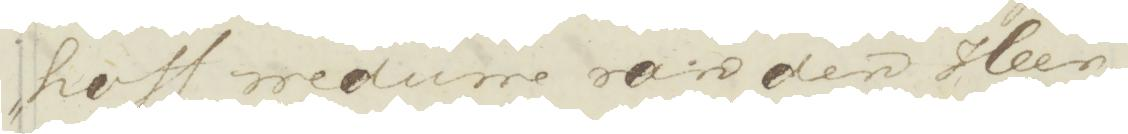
hoff weduwe van den Heer
